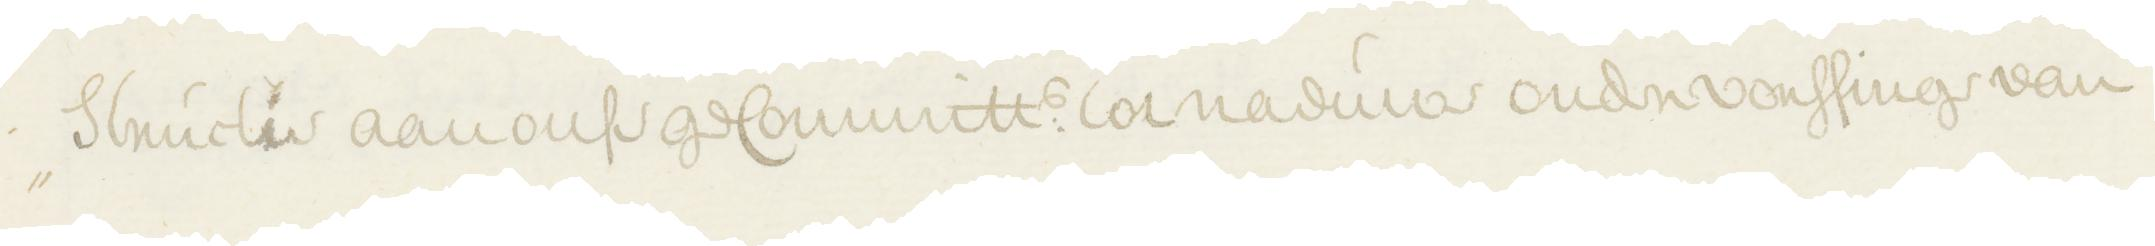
„structie aan onse gecommitt:s tot naeuwe onder vorssinge van
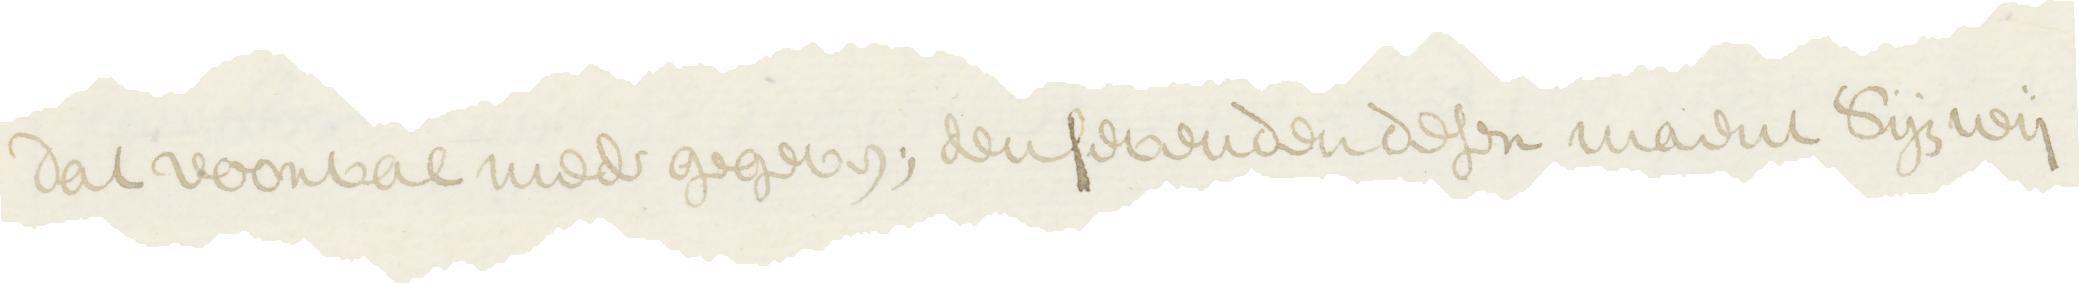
dat voorval mede gegeven; den sevenden deser maent sijn wij
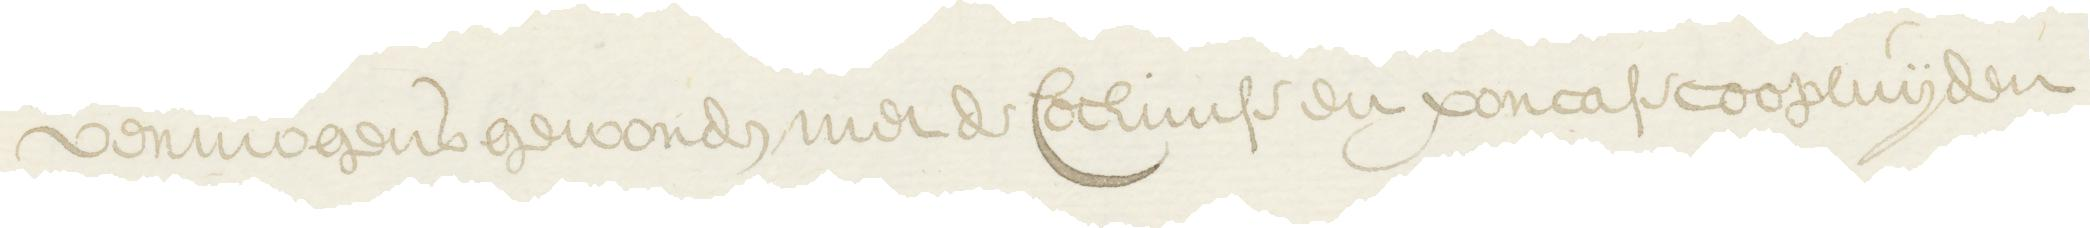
vermogens geworden met de Cochimse en porcase coopluijden
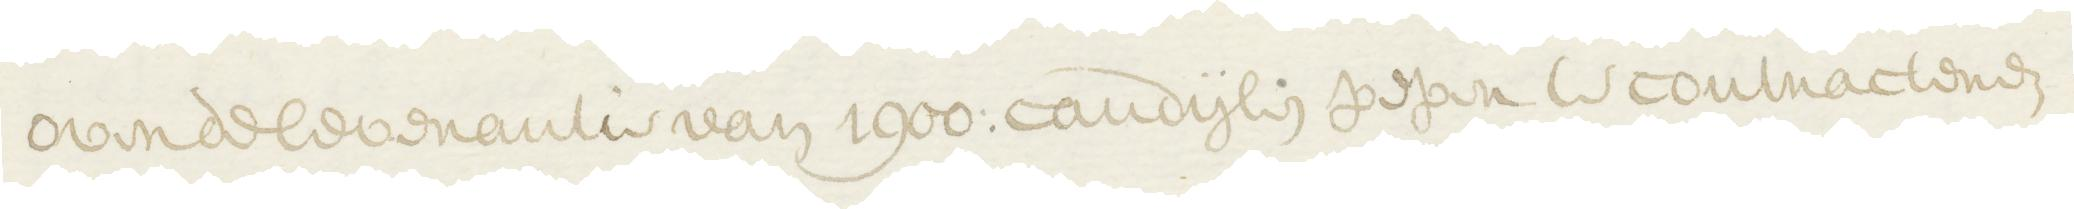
over de leverantie van 1900: candijlen peper te contracteren
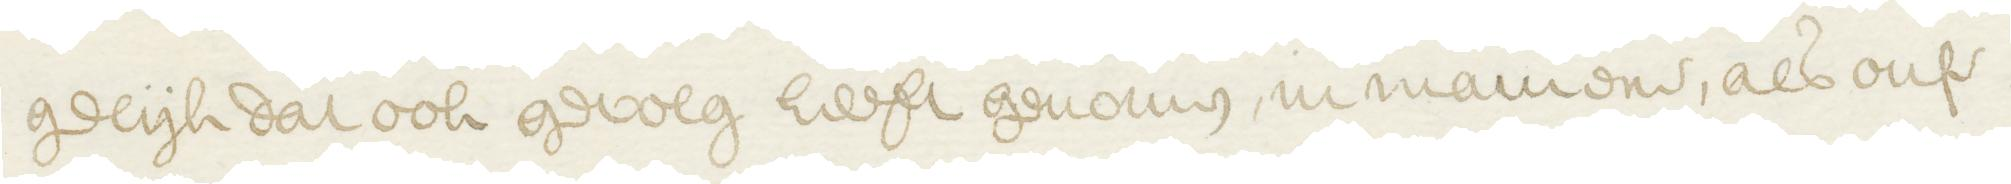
gelijk dat ook gevolg heeft genomen, in maniere, als onse
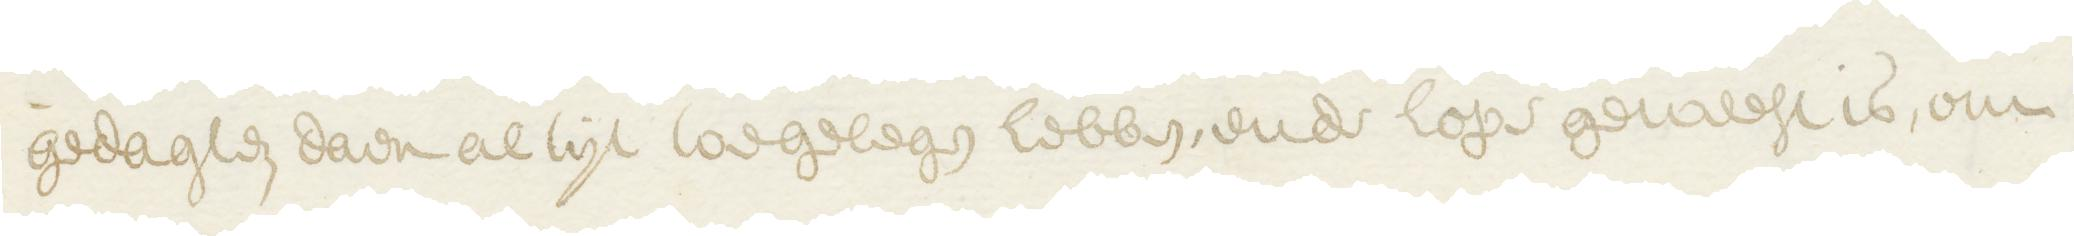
gedagten daer al tijt toegelegen hebben, ende hope geweest is, om
